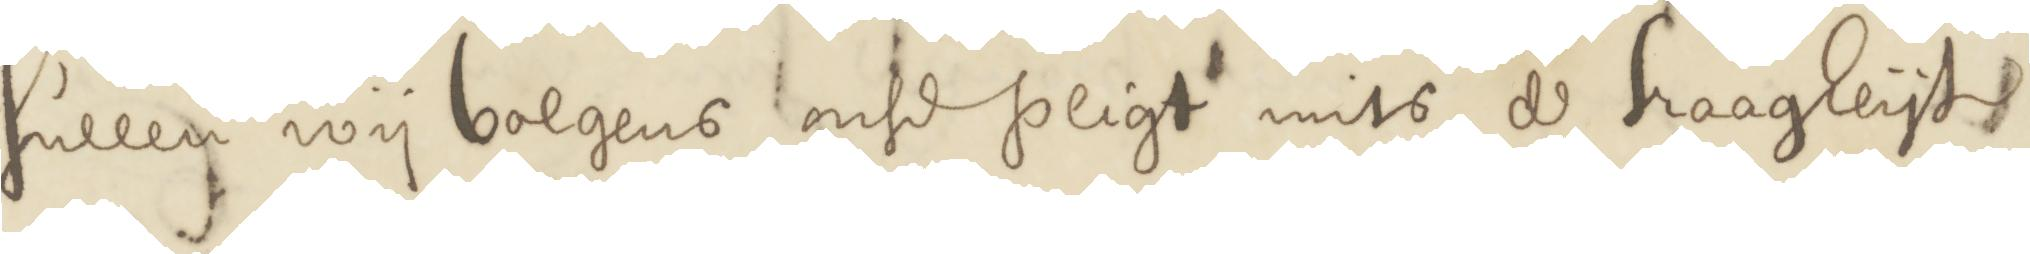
sullen wij volgens onse pligt mits de traagheijt
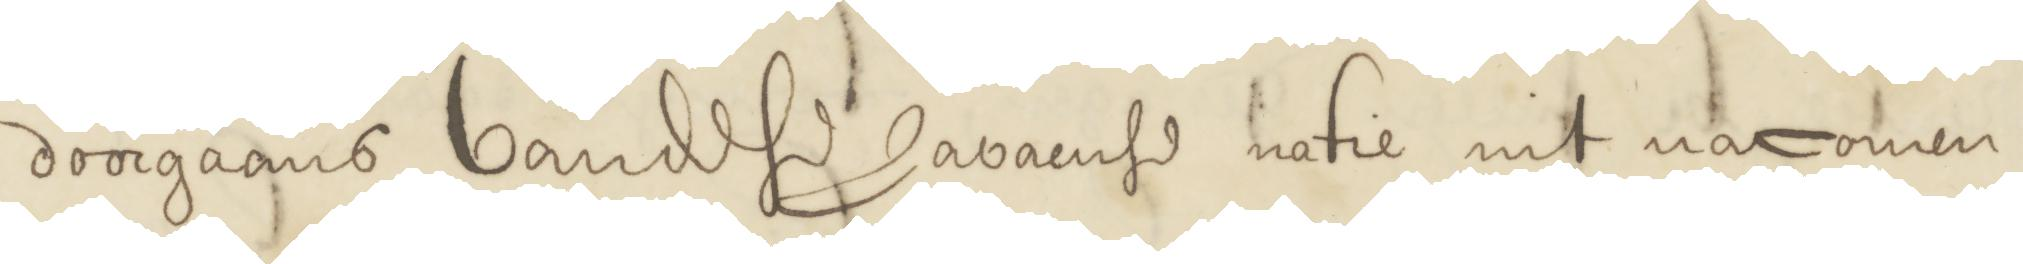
doorgaans vandese Javaense natie int nacomen
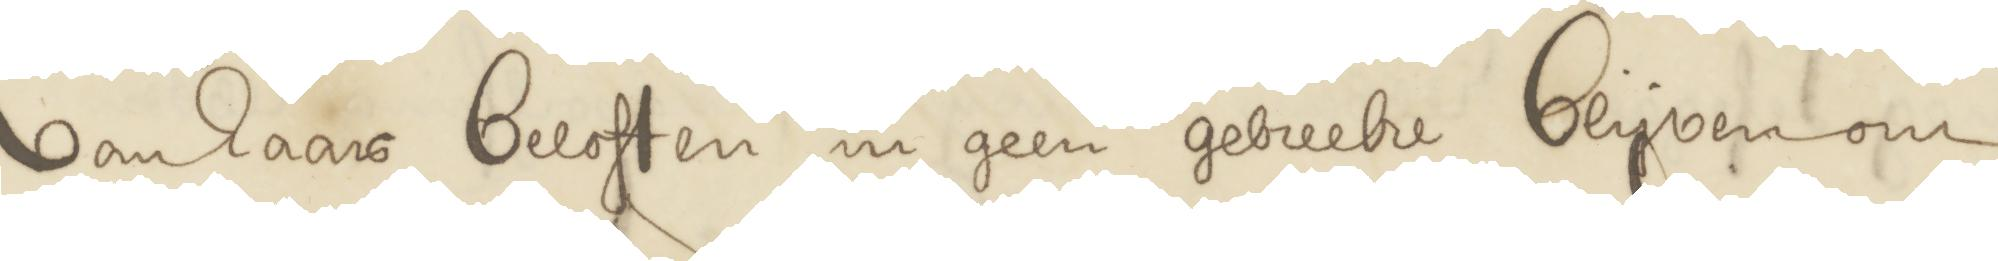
van haar beloften in geen gebreeke blijven om
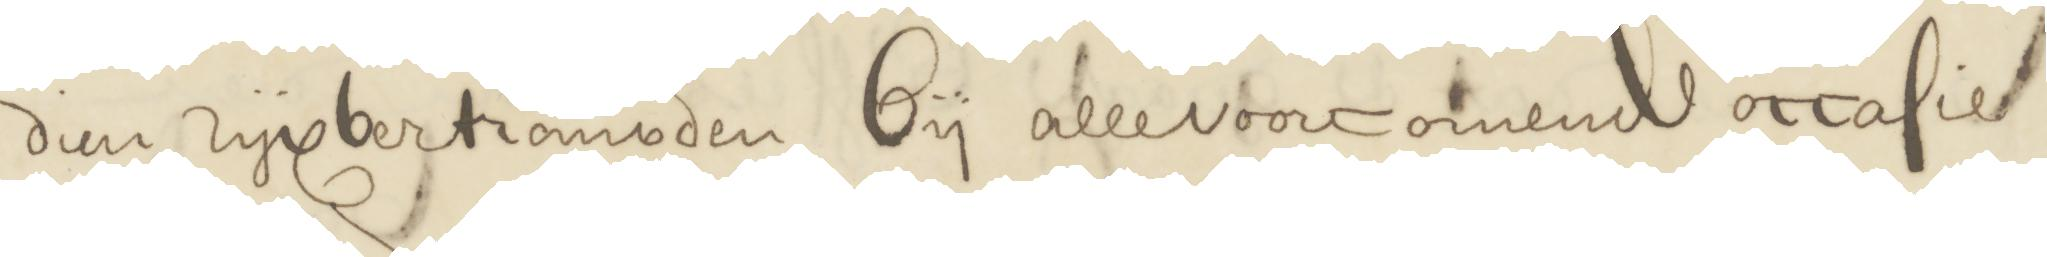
dien rijxvertrouwden bij alle voorcomende occasie
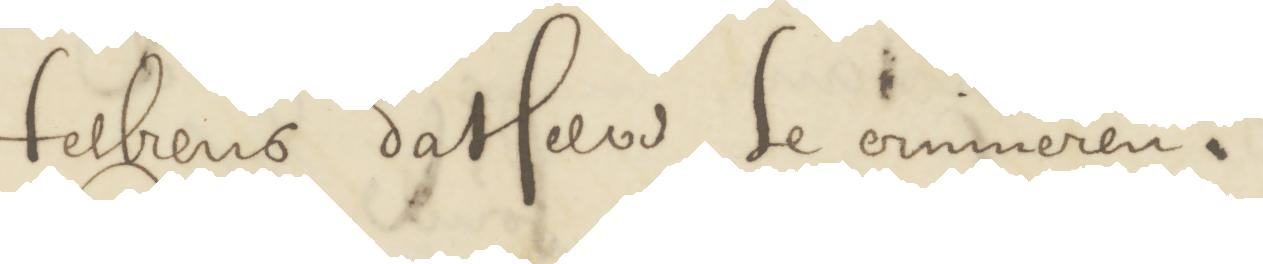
telkens datselve te eruineren.
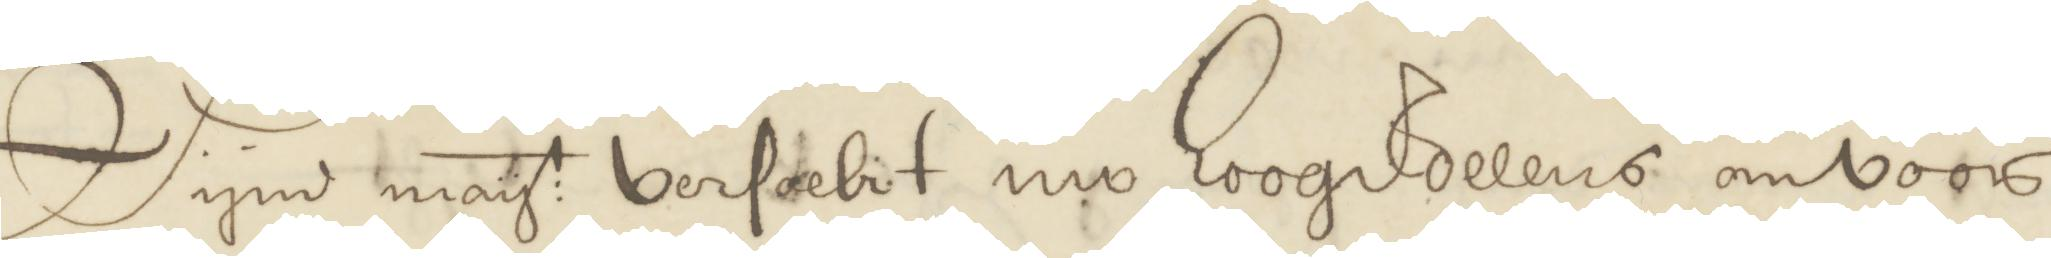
Sijne maij:t versoekt uw hoog Edelens om voor
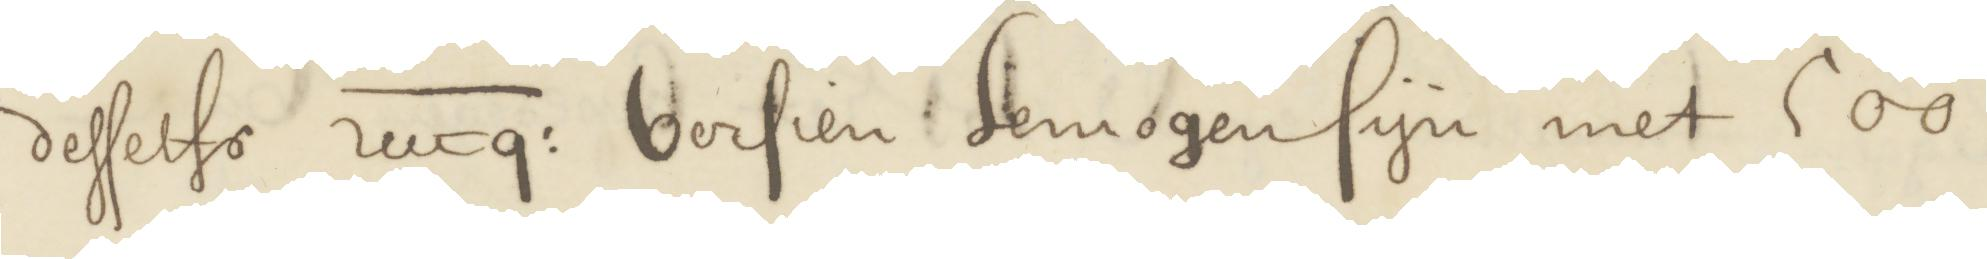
desselfs reecq: versien temogen sijn met 500
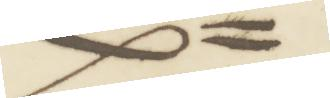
p=s
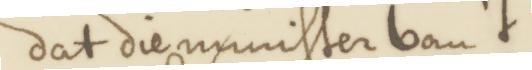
dat die minister van ’t
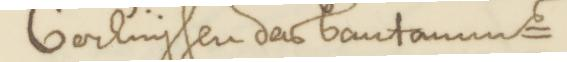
verhuijsen das bantamm=s
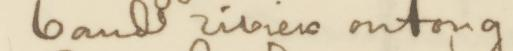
vande rivier ontong
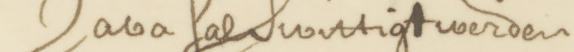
Java sal verwittigt werden
